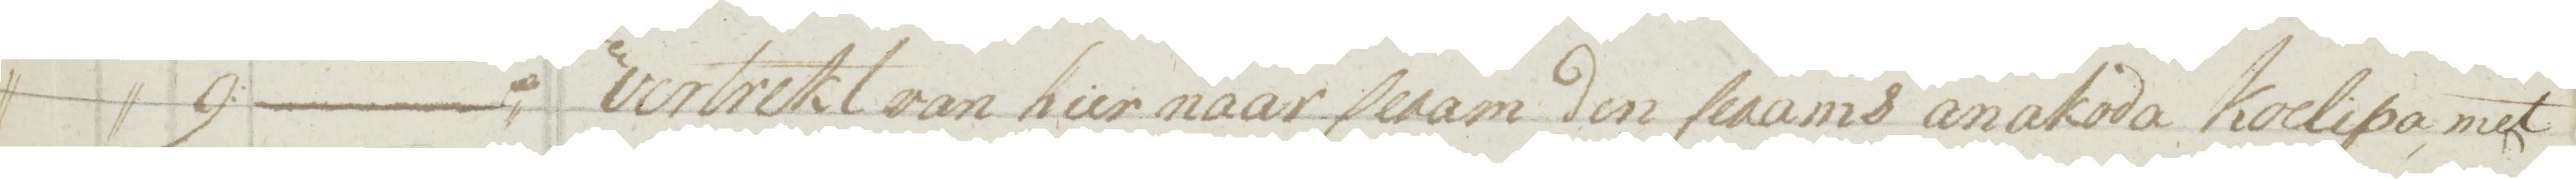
„ „ 9: _„o Vertrekt van hier naar Ceram den Cerams anakoda Koelipa, met
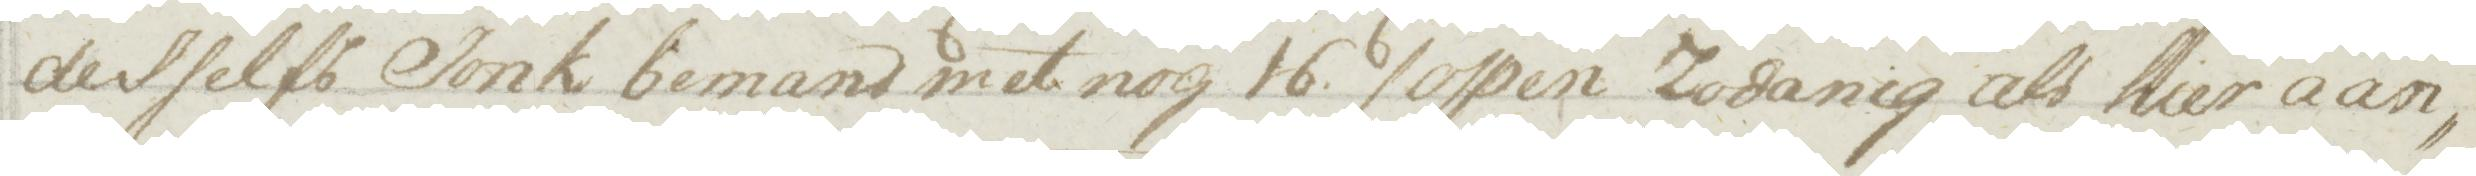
desselfs Ionk bemand met nog 16. coppen zodanig als hier aan„
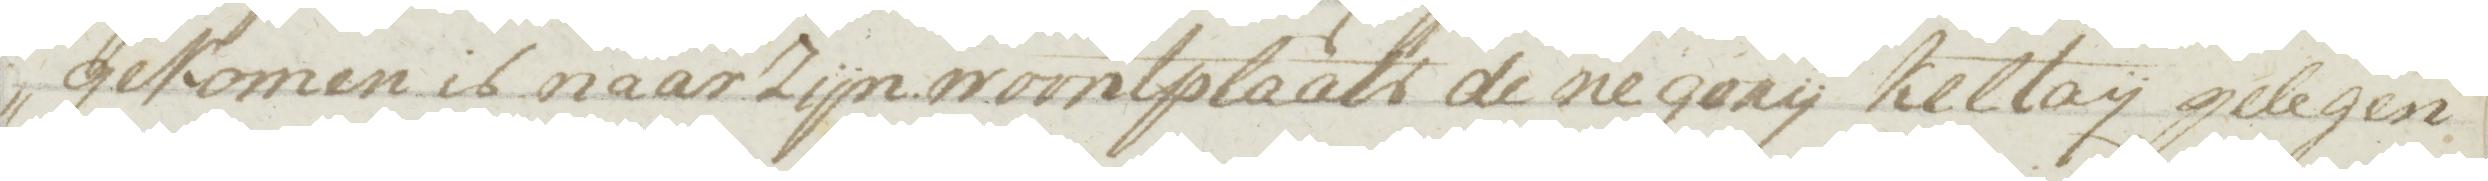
„gekomen is naar zijn woontplaats de negorij keltaij gelegen
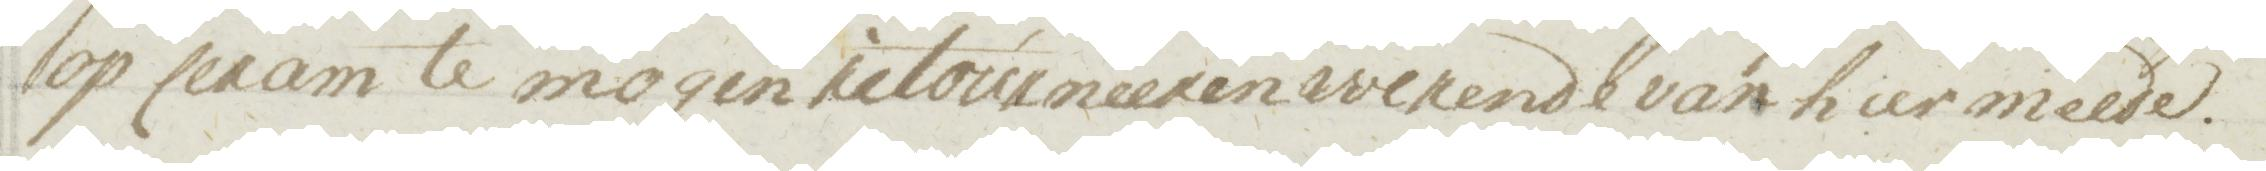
op Ceram te mogen retourneeren voerende van hier meede.
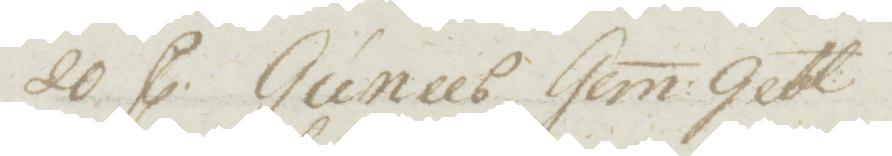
20 p.s Gunees gem: gebl:
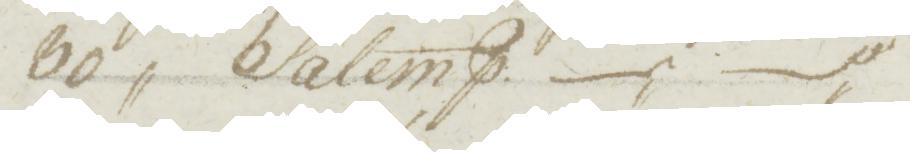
30 „ Salemp. _„ _„
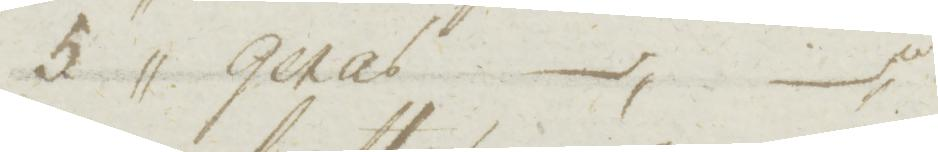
5 „ geras _„ _
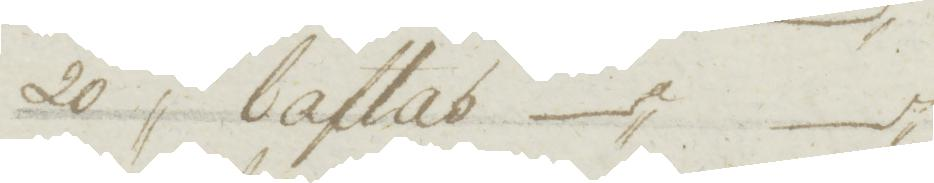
20 „ baftas _„ _„
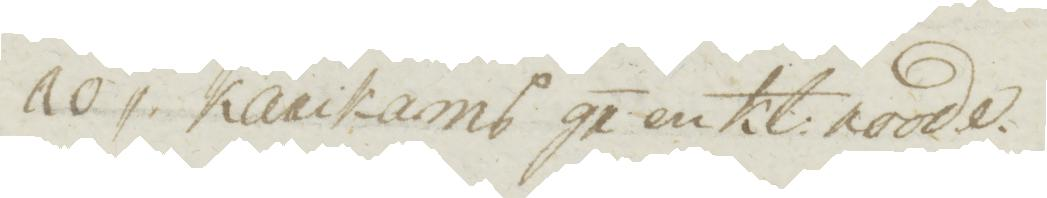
40 „ Karikams gr: en kl: roode.
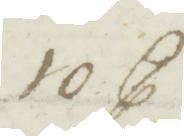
10 ps
